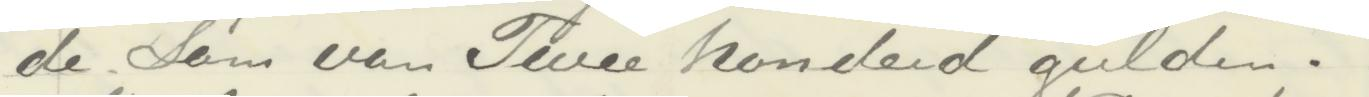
de Som van Twee honderd gulden.
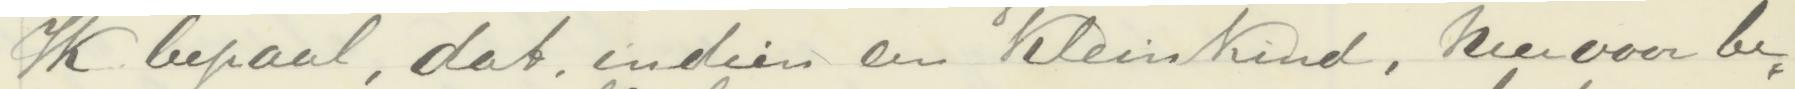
Ik bepaal, dat, indien een kleinkind, hiervoor be=
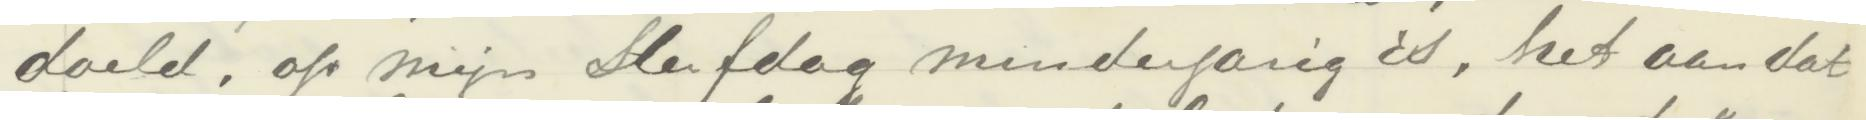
doeld, op mijn sterfdag minderjarig is, het aan dat
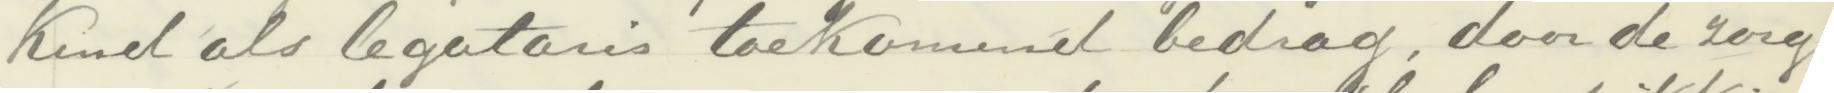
kind als legataris toekomend bedrag, door de zorg
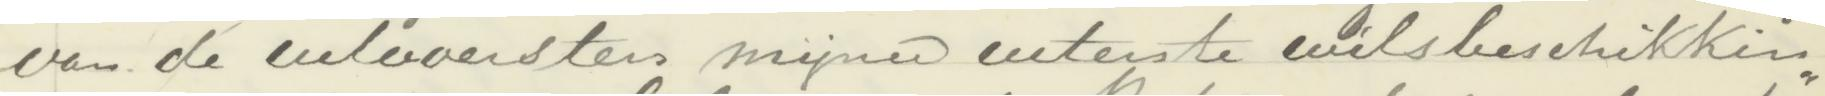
van de uitvoersters mijnen uiterste wilsbeschikkin„
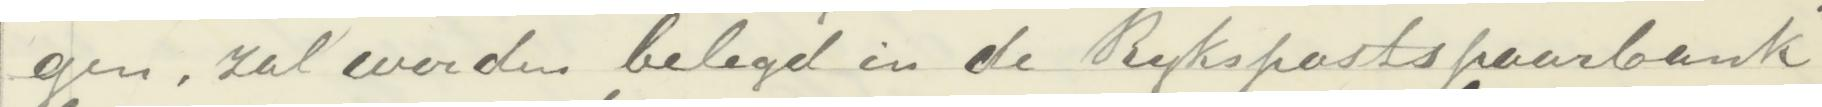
gen, zal werden belegd in de Rykspostspaarbank
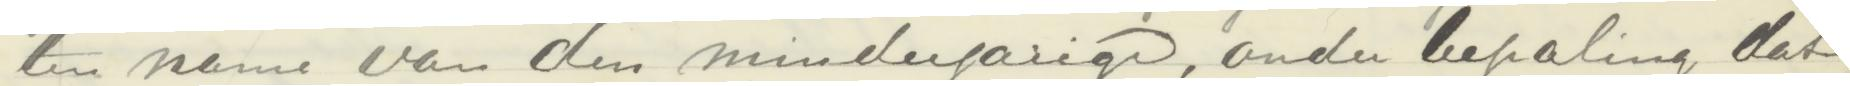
ten name van den minderjarige, onder bepaling dat
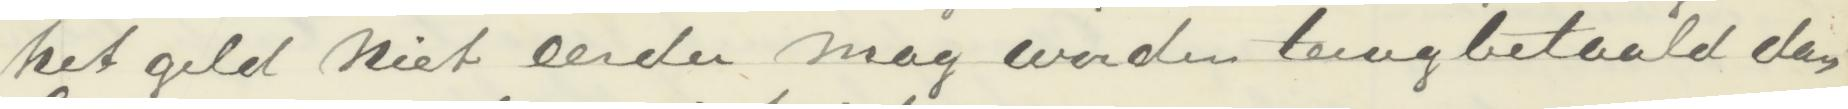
het geld niet eerder mag worden terugbetaald dan
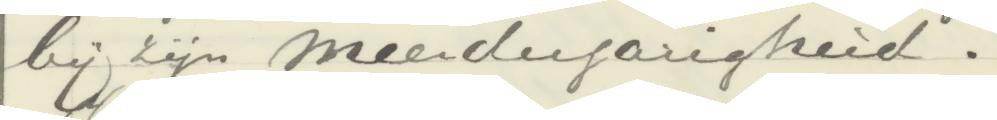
bij zijn meerderjarigheid.
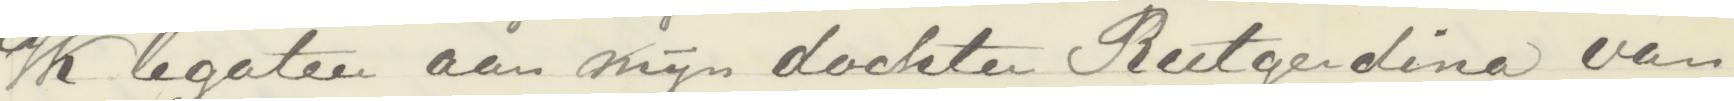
Ik legateer aan mijn dochter Rutgerdina van
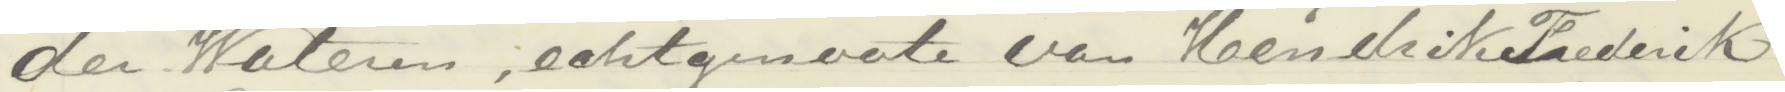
der Wateren, echtgenoote van Hendrik Frederik
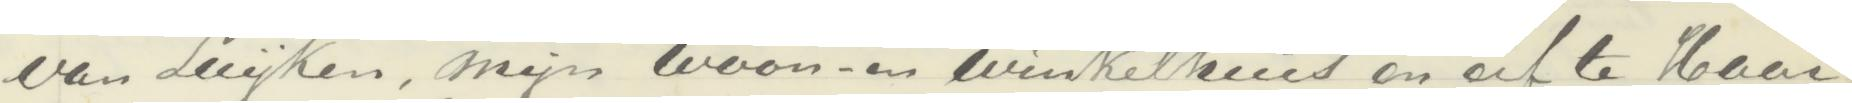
van Luijken, mijn woon - en winkelhuis en erf te Haar=
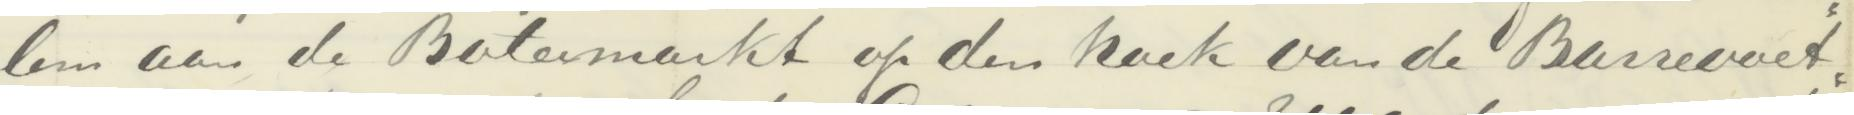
lem aan de Botermarkt op den hoek van de Barrevoet=
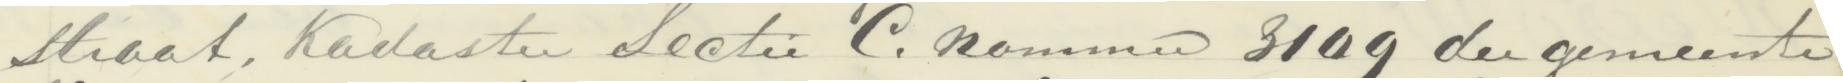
straat, kadaster Sectie C. Nommer 3109 der gemeente
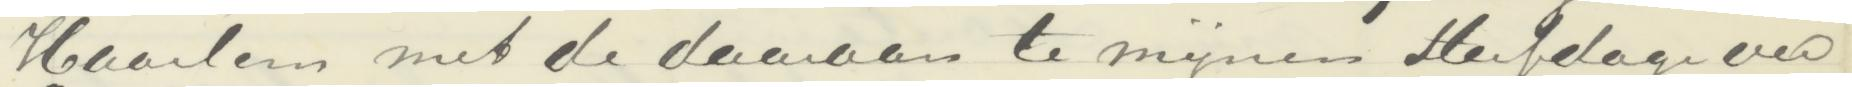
Haarlem met de daaraan te mijnen sterfdage ver
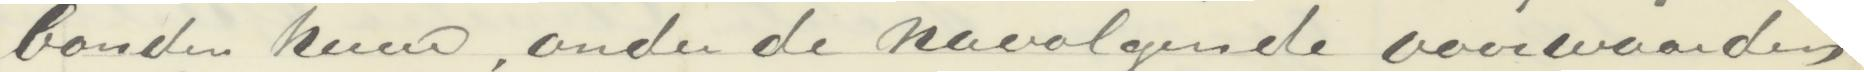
bonden huur, onder de navolgende voorwaarden
